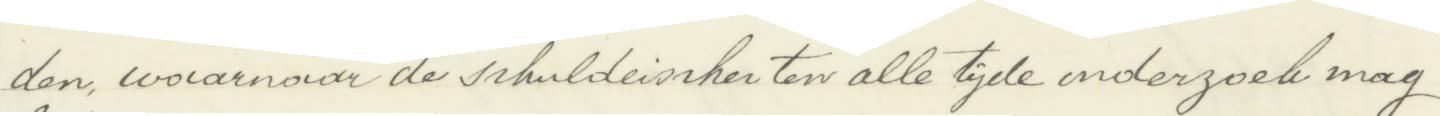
den, waarnaar de schuldeischer ten alle tijde onderzoek mag
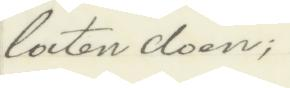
laten doen;
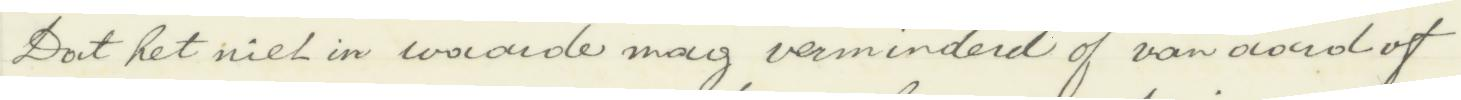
Dat het niet in waarde mag verminderd of van aard of
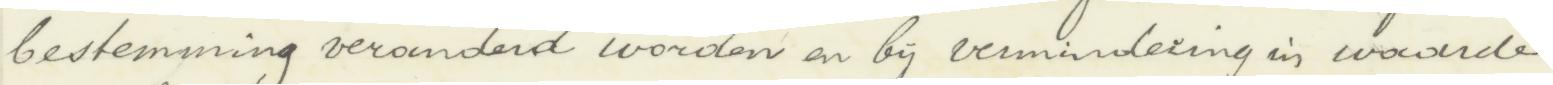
bestemming veranderd worden en bij vermindering in waarde
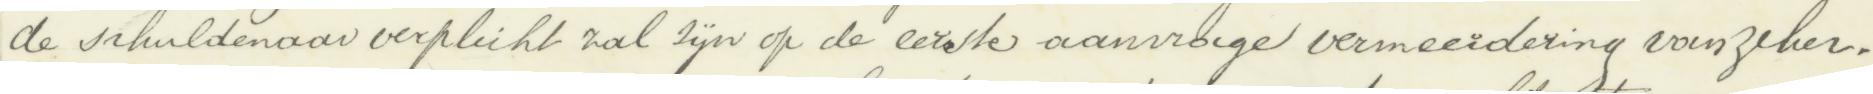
de schuldenaar verplicht zal zijn op de eerste aanvrage vermeerdering van zeker
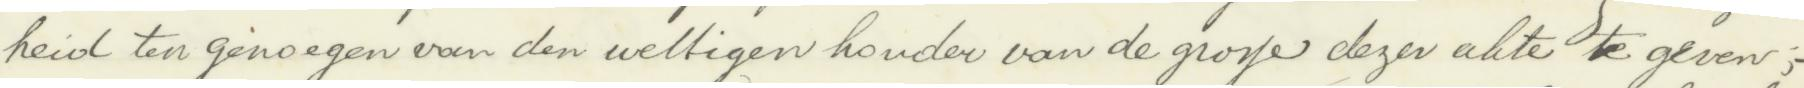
heid ten genoegen van den wettigen houder van de grosse dezer akte te geven
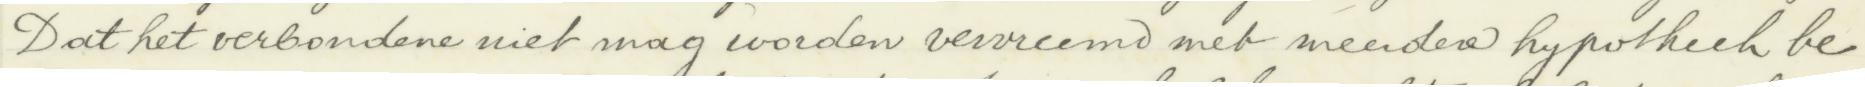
Dat het verbondene niet mag worden vervreemd met meerdere hypotheek be
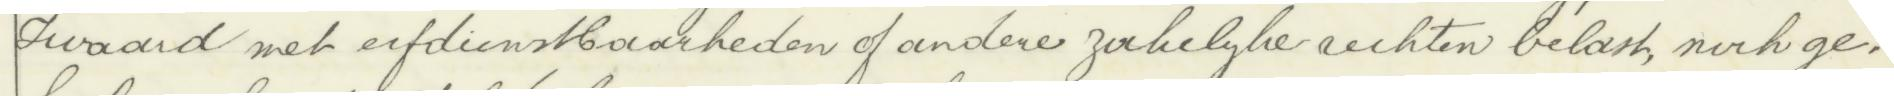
zwaard met erfdienstbaarheden of andere zakelyke rechten belast, noch ge-
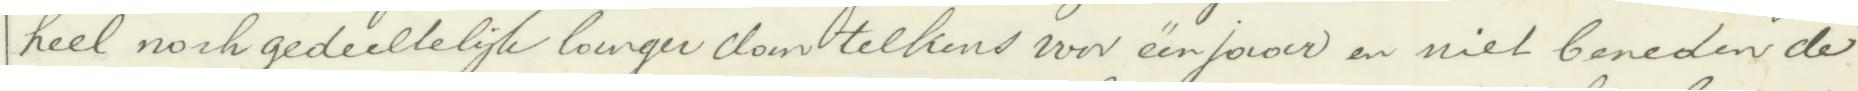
heel noch gedeeltelijk langer dan telkens voor één jaar en niet beneden de
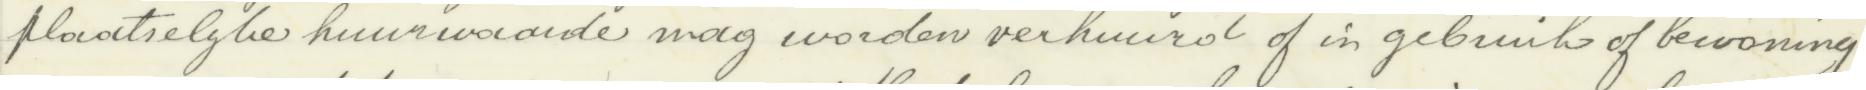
plaatselyke huurwaarde mag worden verhuurd of in gebruik of bewoning
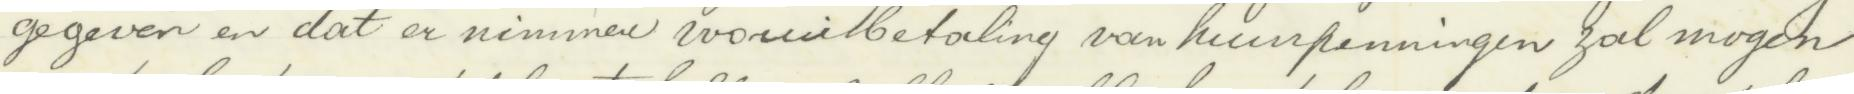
gegeven en dat er nimmer vooruitbetaling van huurpenningen zal mogen
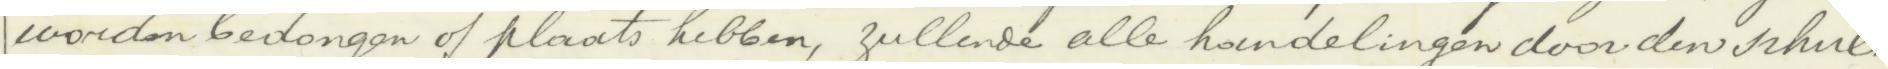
worden bedongen of plaats hebben, zullende alle handelingen door den schul
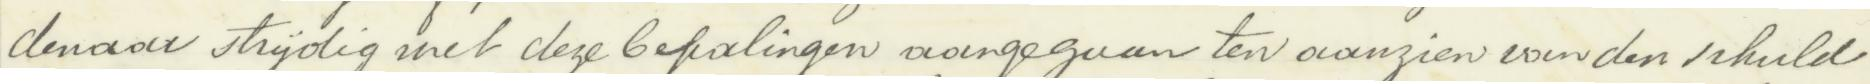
denaar strijdig met deze bepalingen aangegaan ten aanzien van den schuld
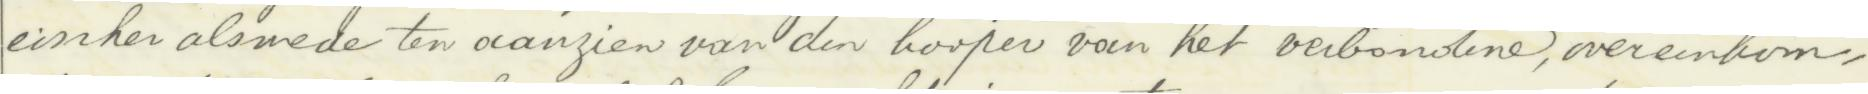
eischer alsmede ten aanzien van den kooper van het verbondene, overeenkom-
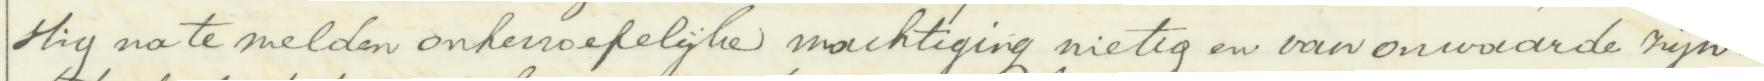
stig na te melden onherroepelijke machtiging nietig en van onwaarde zijn.
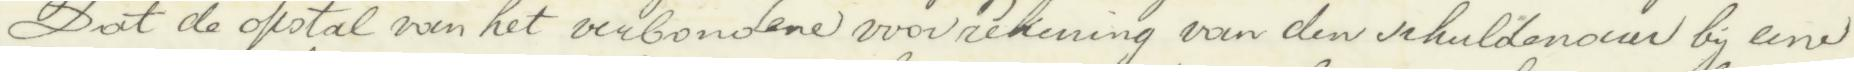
Dat de opstal van het verbondene voor rekening van den schuldenaar bij eene
